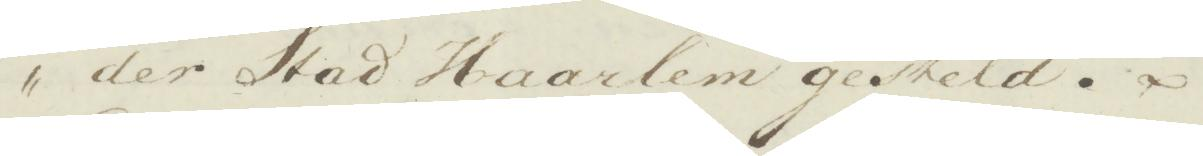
„ der Stad Haarlem gesteld.
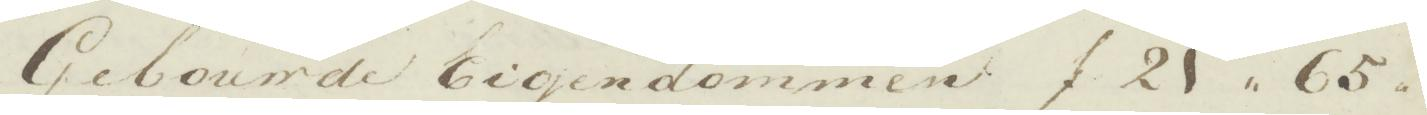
Gebouwde Eigendommen ƒ 21 „ 65„
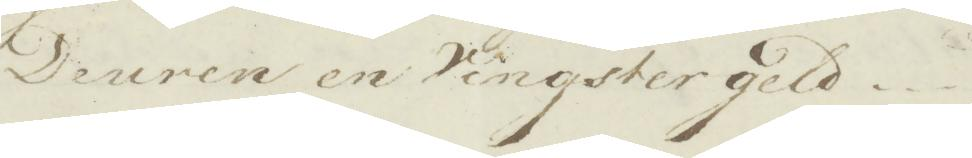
Dereven en Vengster geld ---
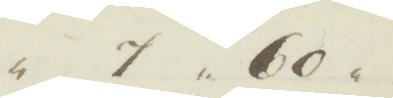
„ 7 „ 60 „
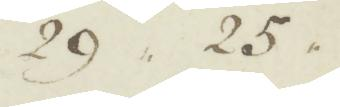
ƒ29 „ 25 „
